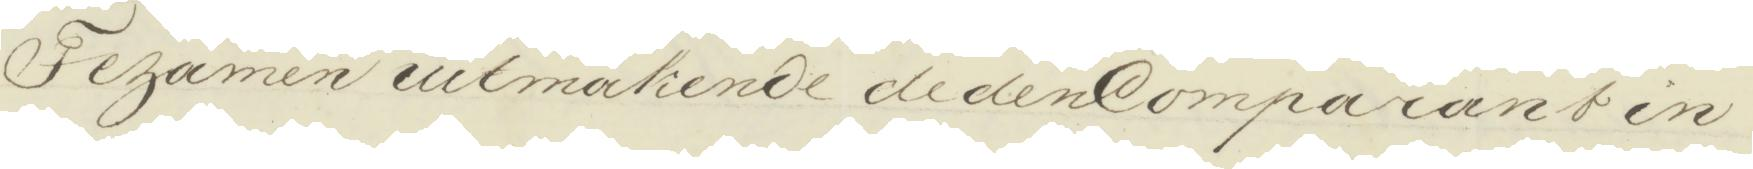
Tezamen uitmakende de den Comparant in
